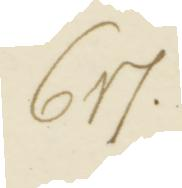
617.
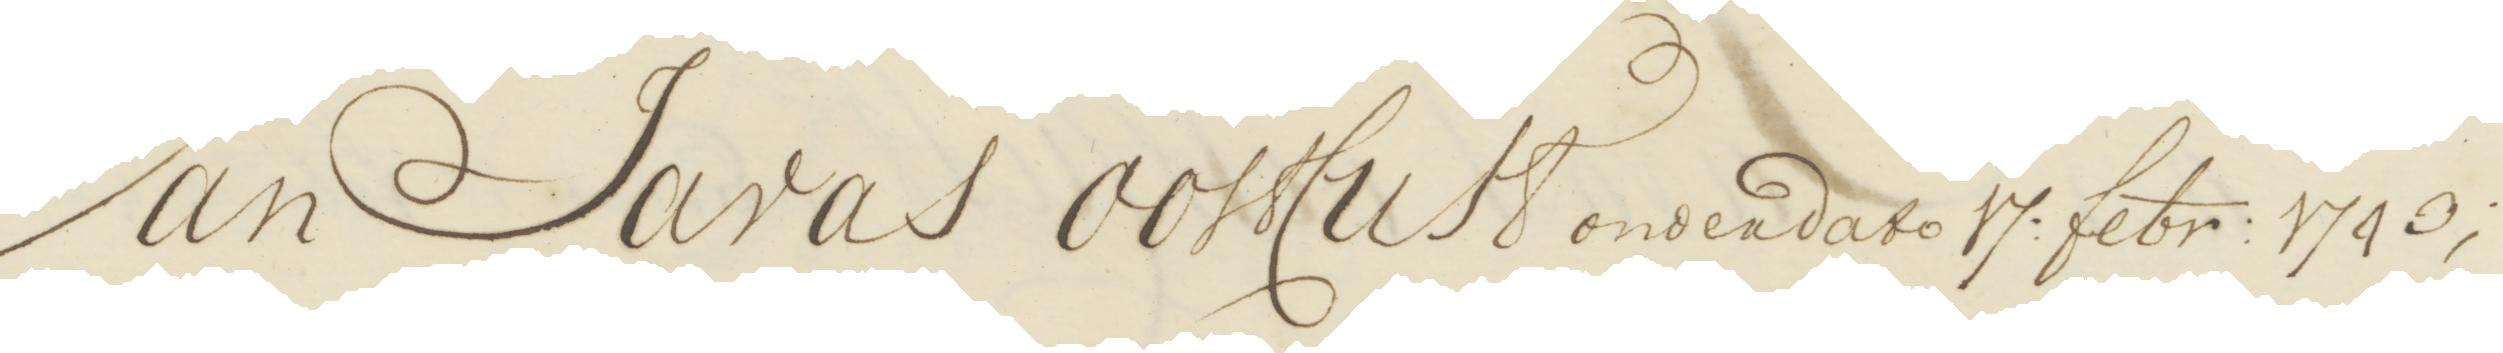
Van Javas oost Cust onder dato 17: febr: 1743;
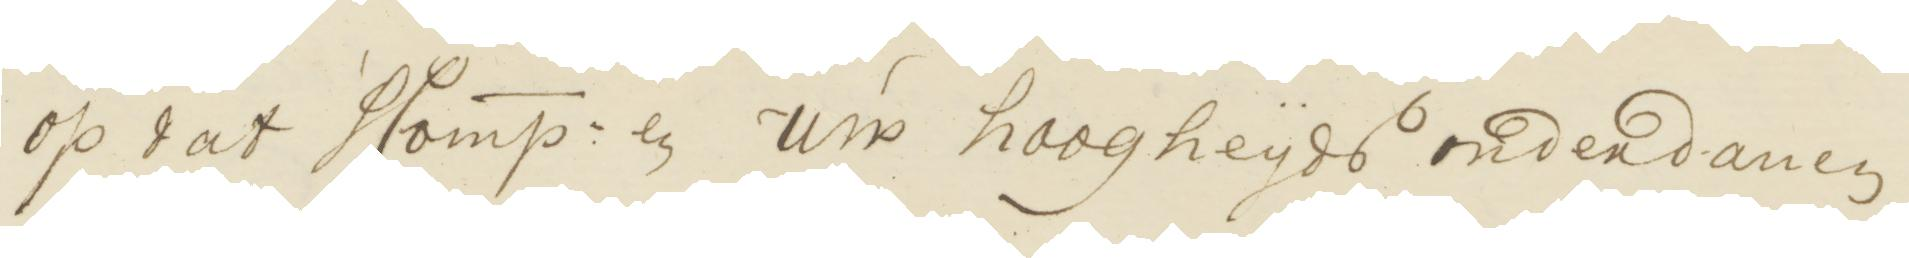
op dat 'sComp: en uw hoogheijds onderdanen
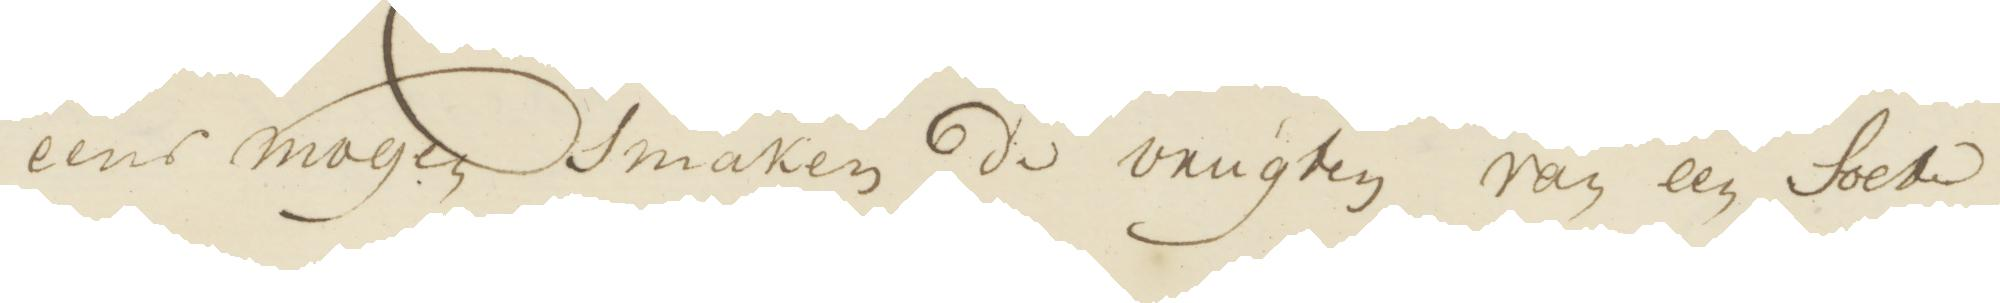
eens mogen smaken de vrugten van een soete
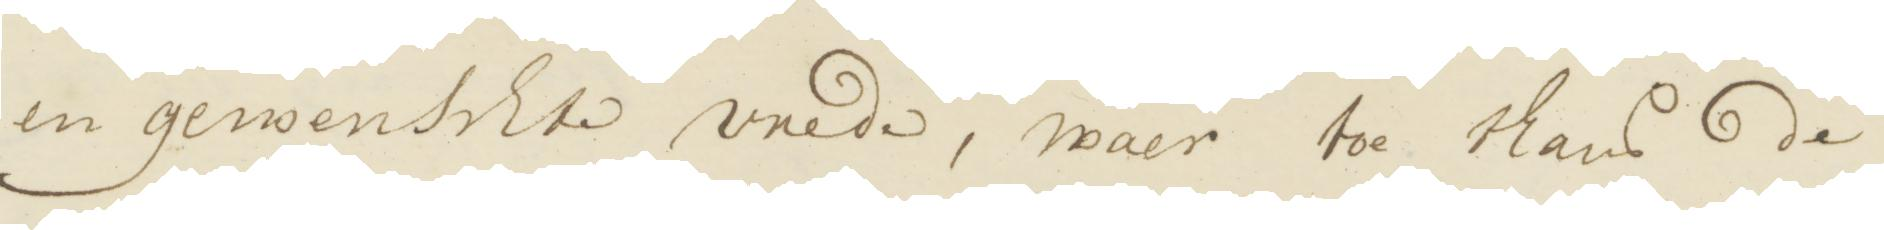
en gewenschte vrede, waer toe thans de
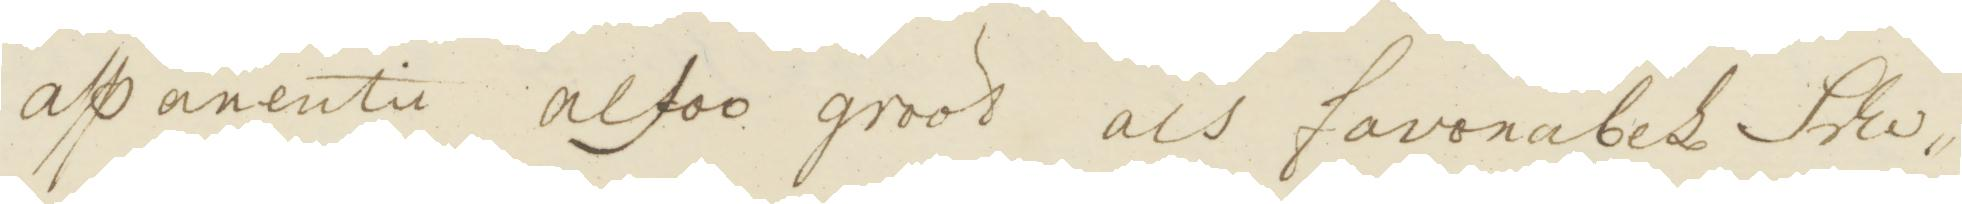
apparentie alsoo groot als favorabel sche„
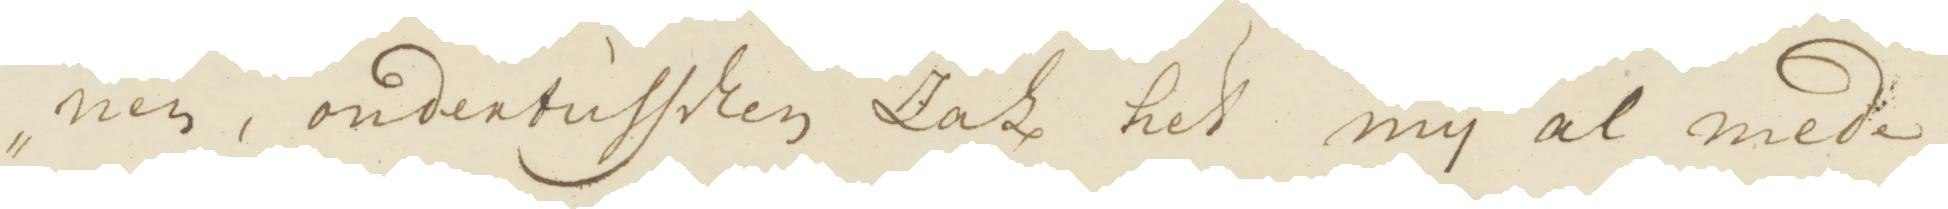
„nen, ondertusschen zal het mij al mede
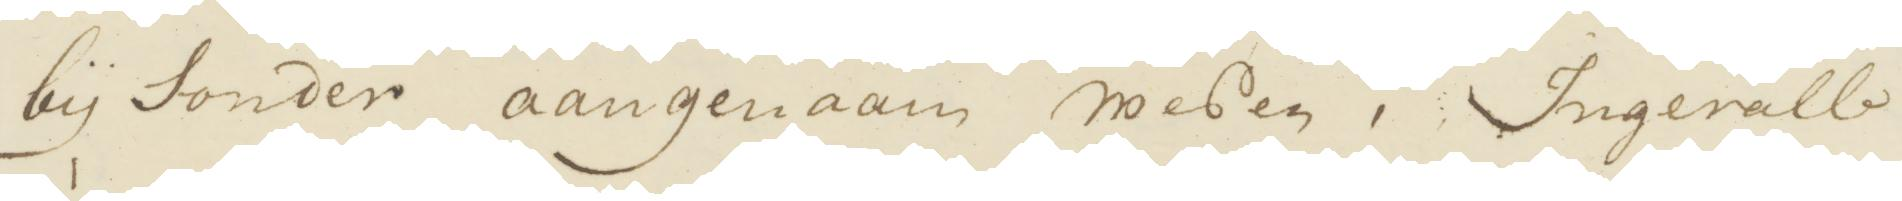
bij sonder aangenaam wesen, Jngevalle
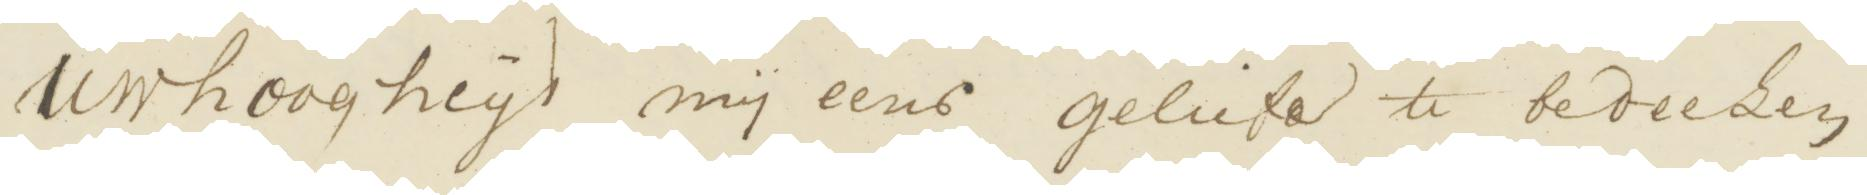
uw hoogheijd mij eens geliefd te bedeelen
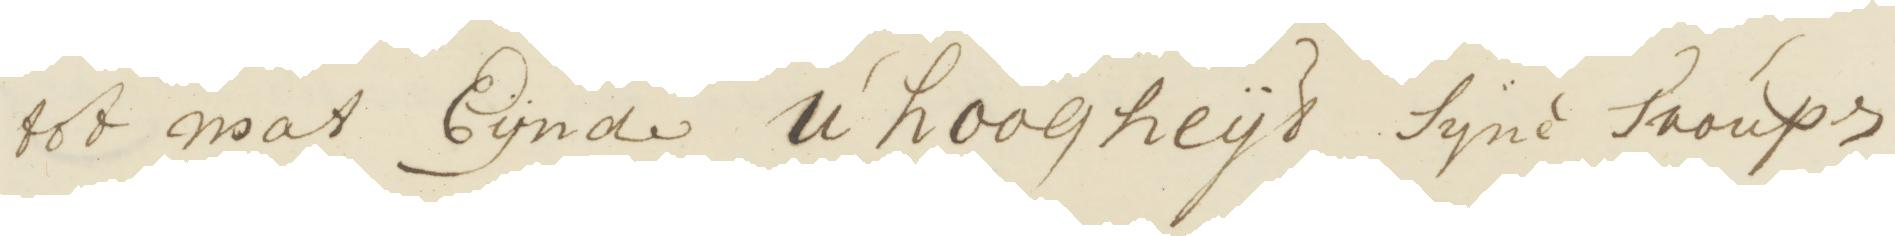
tot wat Eijnde u hoogheijt sijne Troupen
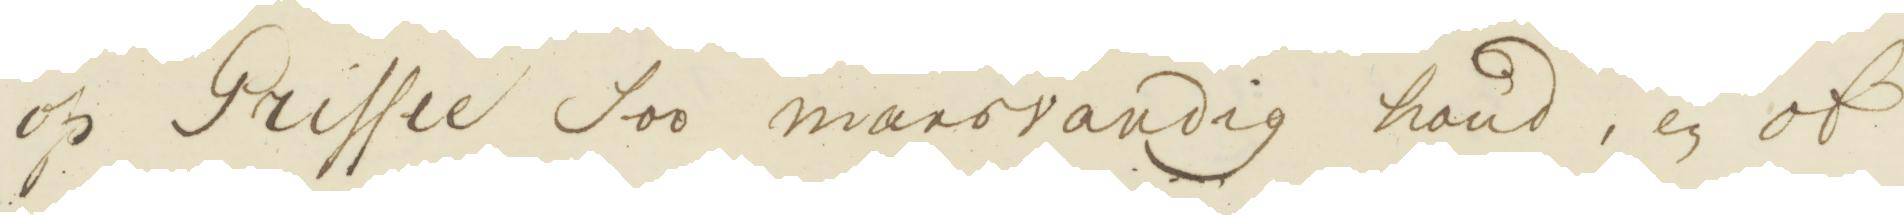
op Grissee soo marsvandig houd, en of
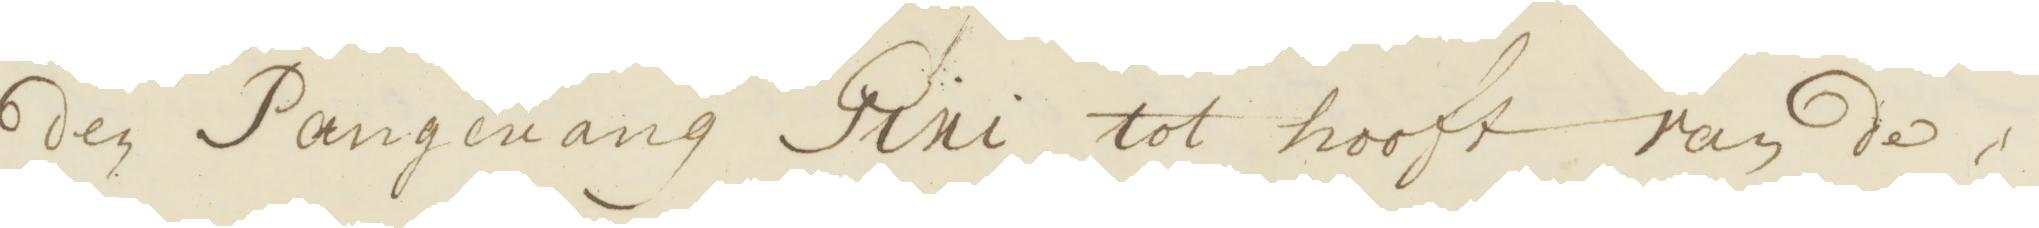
den Pangerang Giri tot hooft van de„
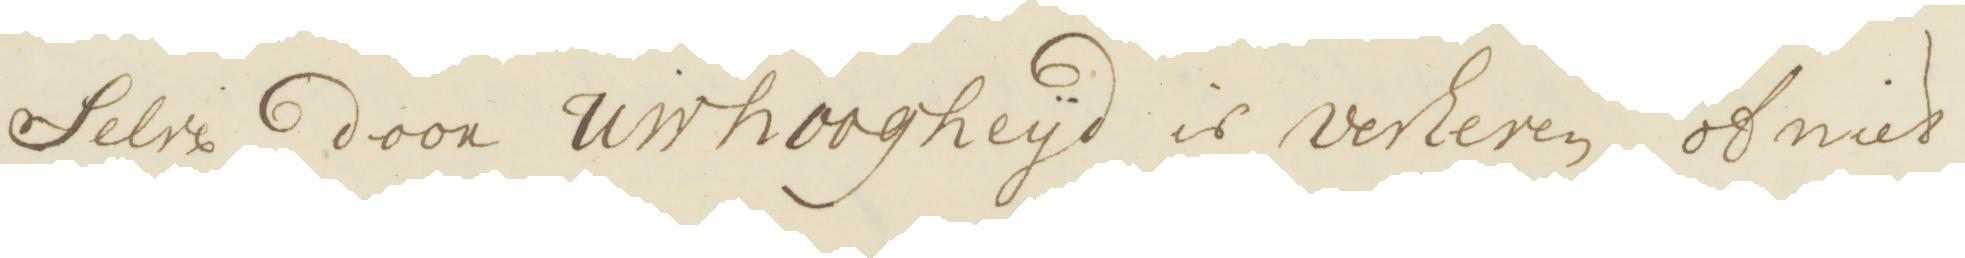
selve door uw hoogheijd is verheven of niet
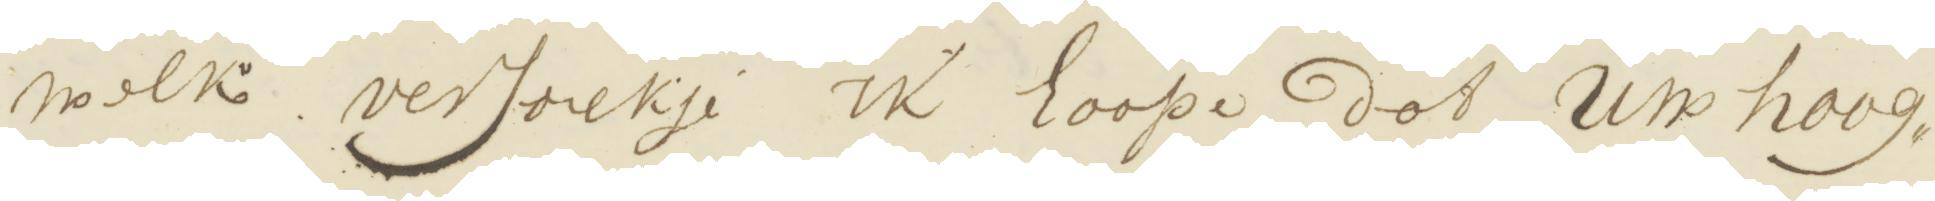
welk versoekje ik hoope dat uw hoog„
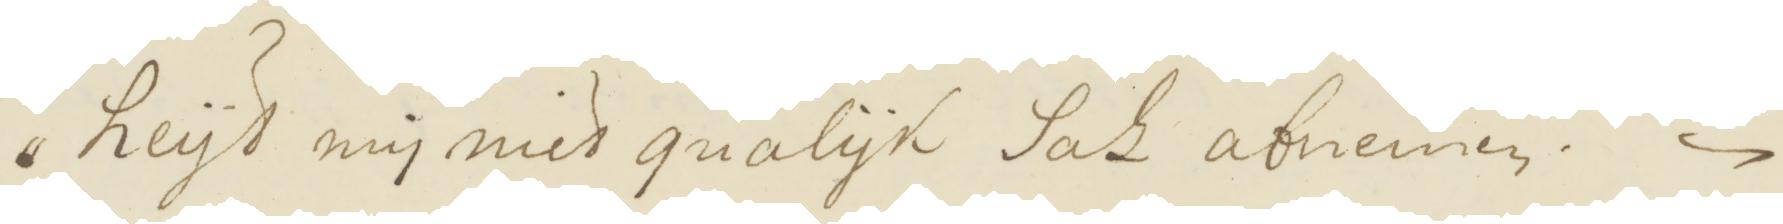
„heijt mij niet qualijk sal afnemen. —
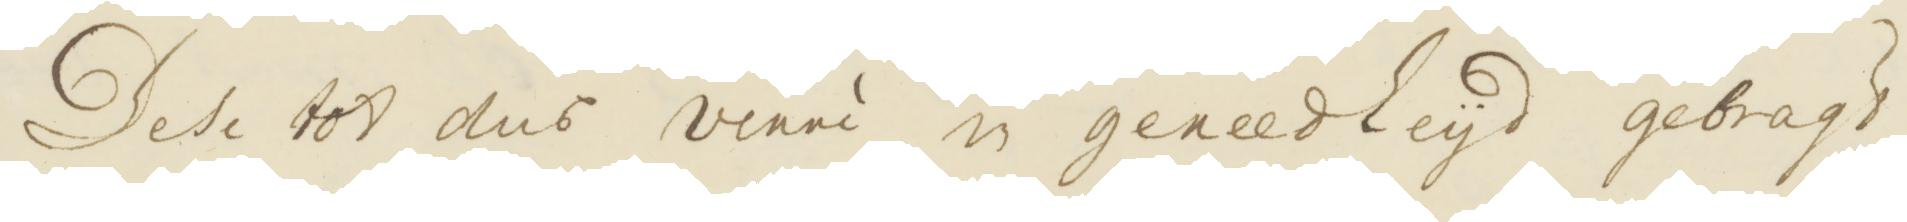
Dese tot dus verre in gereedheijd gebragt
